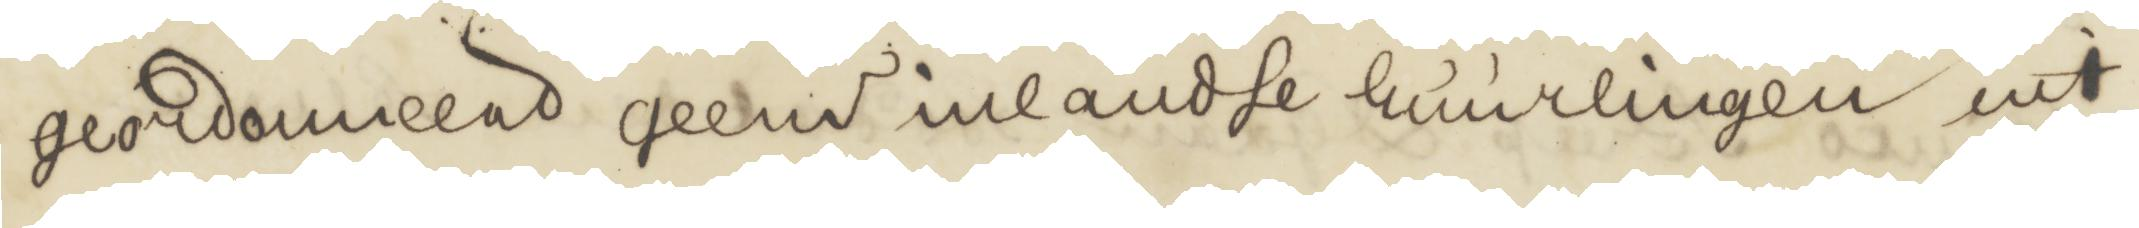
geordonneerd geene inlandse huurlingen in ’t
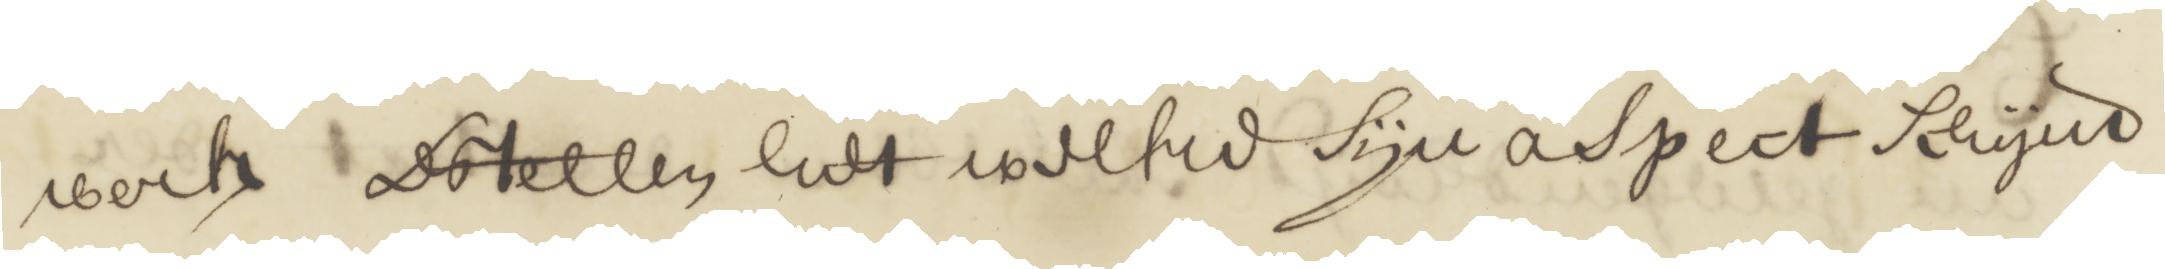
werk testellen het welke sijn aspect schijnd
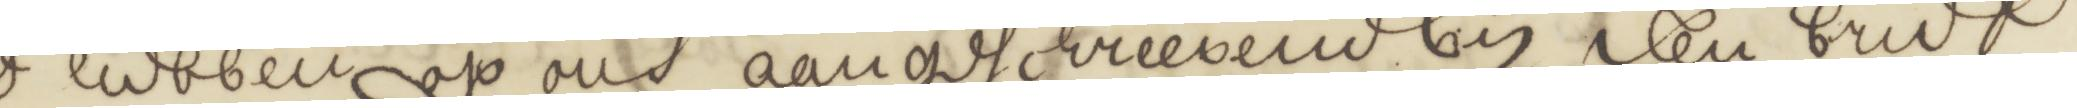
te hebben op ons aangeschreevene bij Een brief
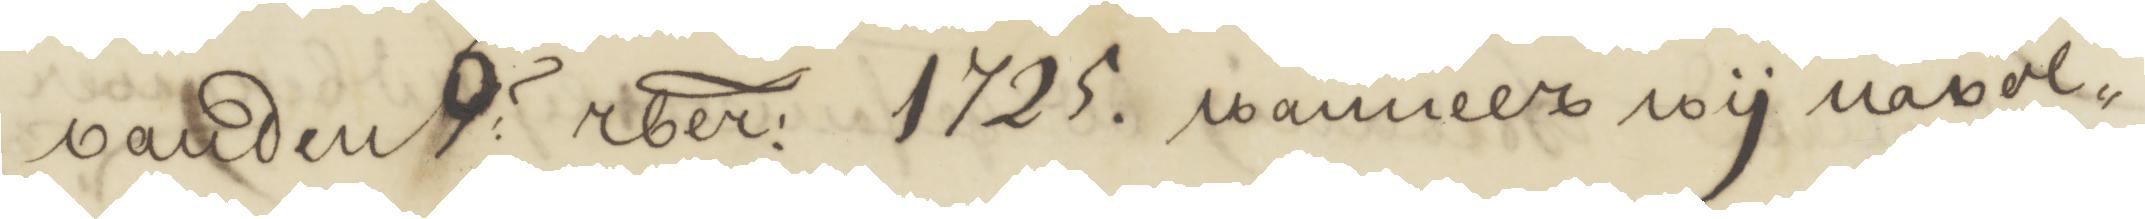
vanden 9:de rber: 1725. wanneer wij navol„
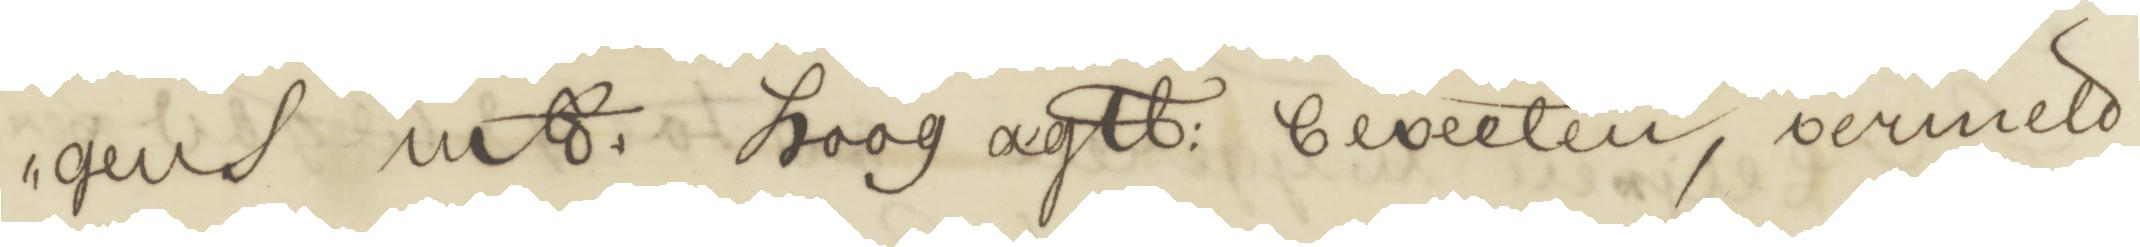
„gens uEd: Hoog agtb: beveelen, vermeld
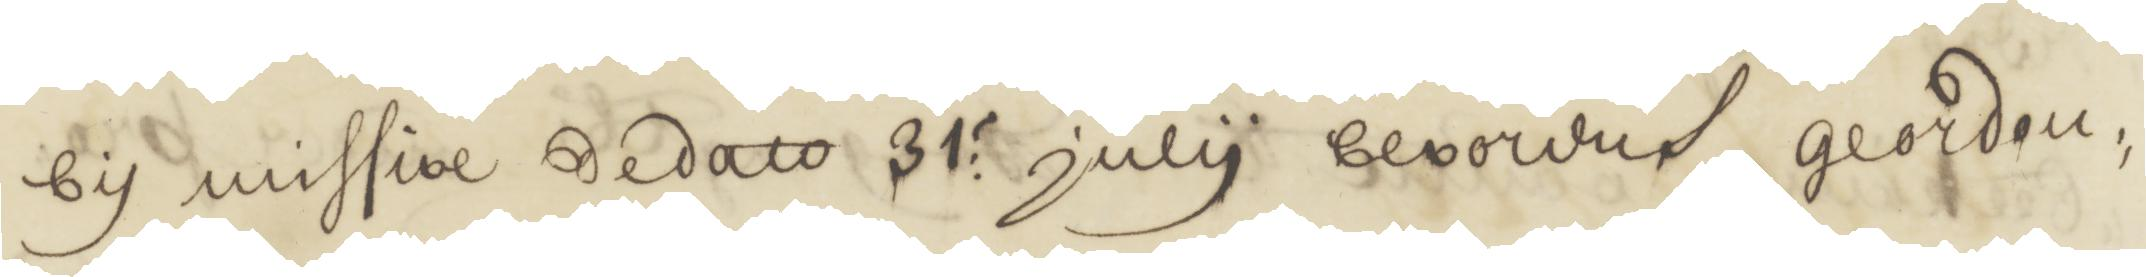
bij missive dedato 31:' julij bevorens geordon„
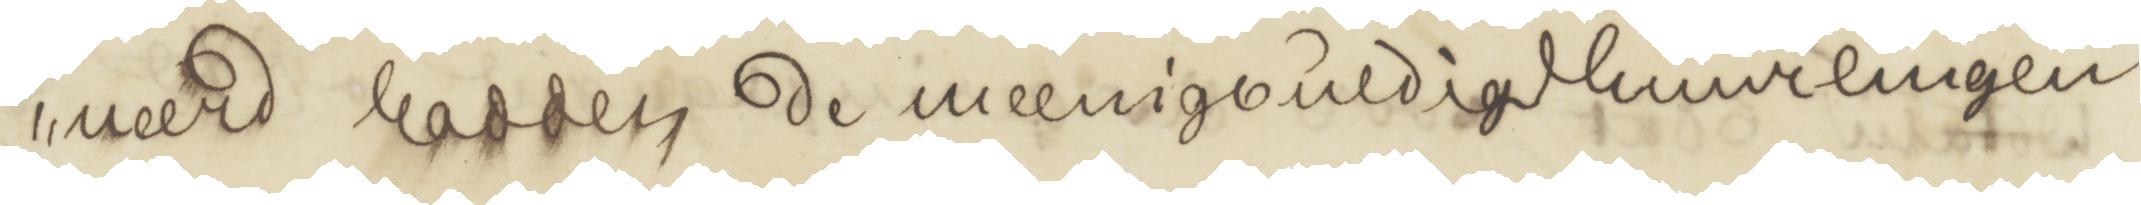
„neerd hadden de meenigvuldige huurlingen
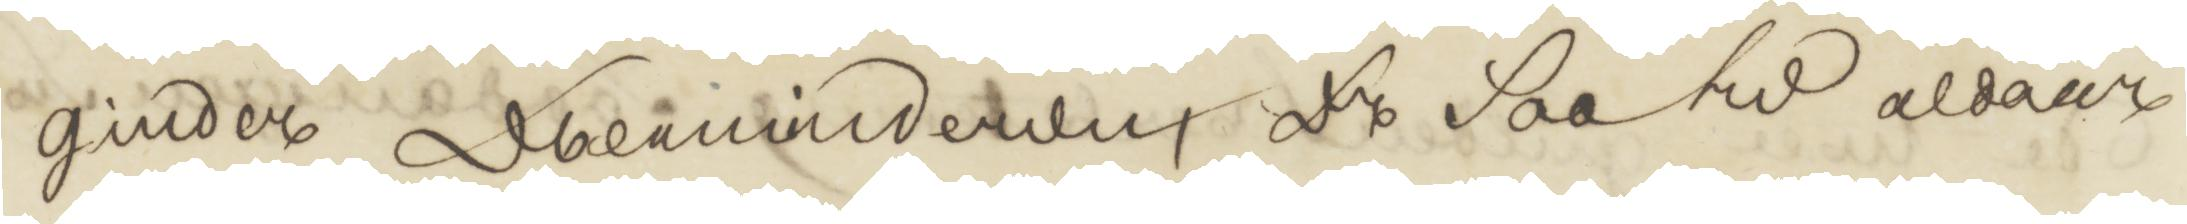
ginder teverminderen, ter saake aldaer
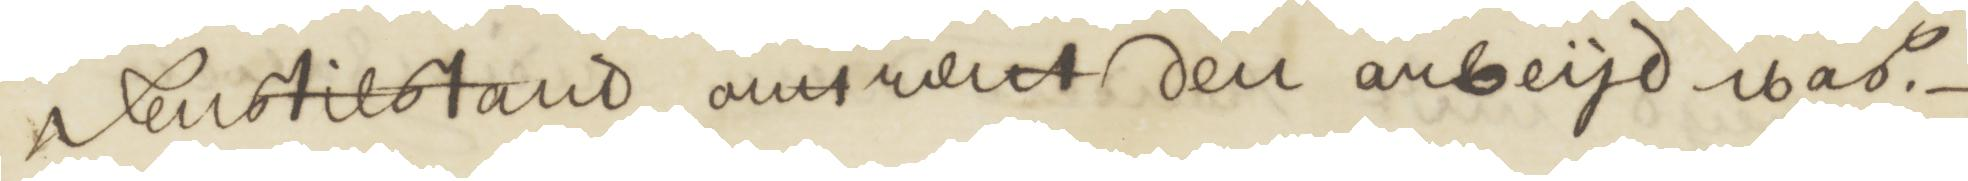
Eenstilstand omtrent den arbeijd was._
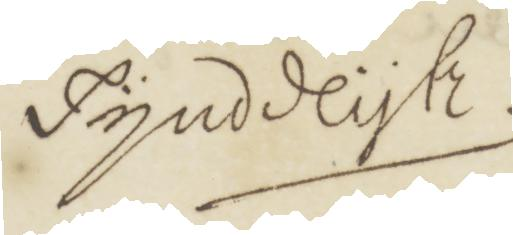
Eijndlijk
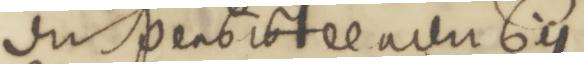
en persisteeren bij
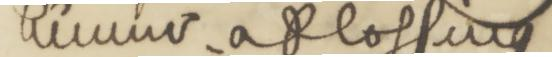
hunne aflossing
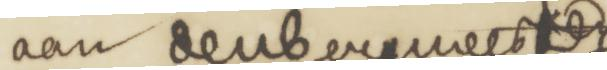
aan den bergmeester
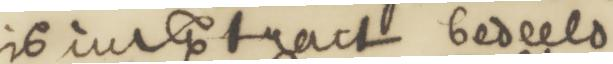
is in Extract bedeeld
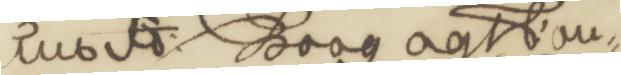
uw Ed: Hoog agtb: on„
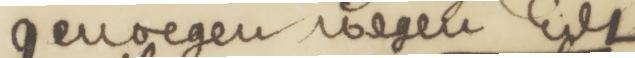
genoegen wegen het
